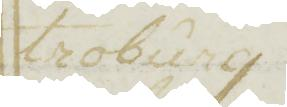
troburg
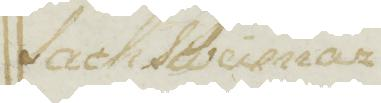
sachsweimar
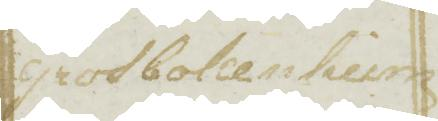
grosbokenheim
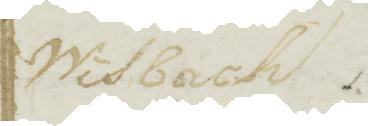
wisbach
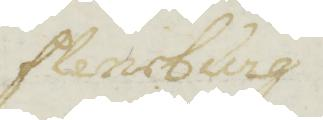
flensburg
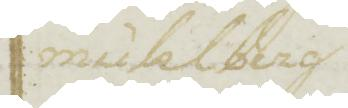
muhlberg
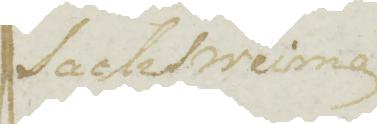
sachsweiman
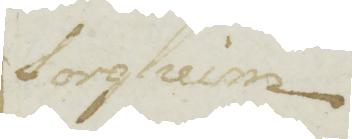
sorgheim
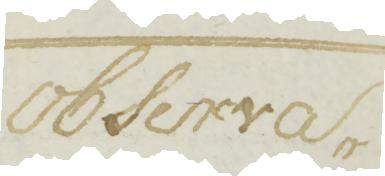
observa„
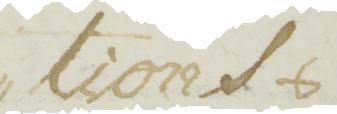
„tions
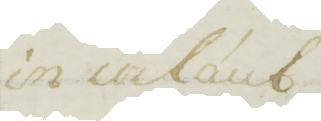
in urlaub
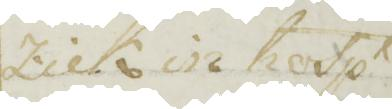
Ziek in hospl
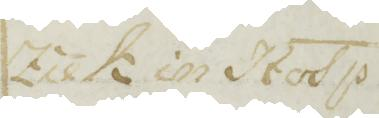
ziek in Hosp
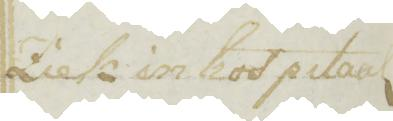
Ziek in hospitaa
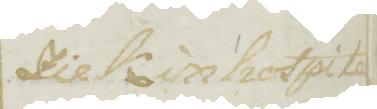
ziek in hospita
